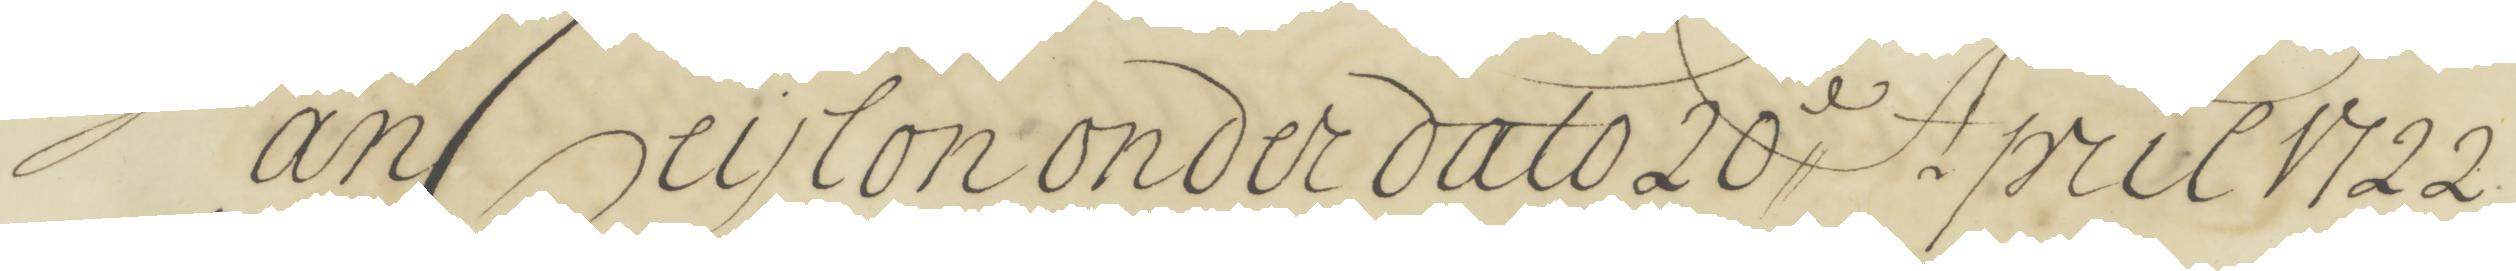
Van Ceijlon onder dato 20„e April 1722.
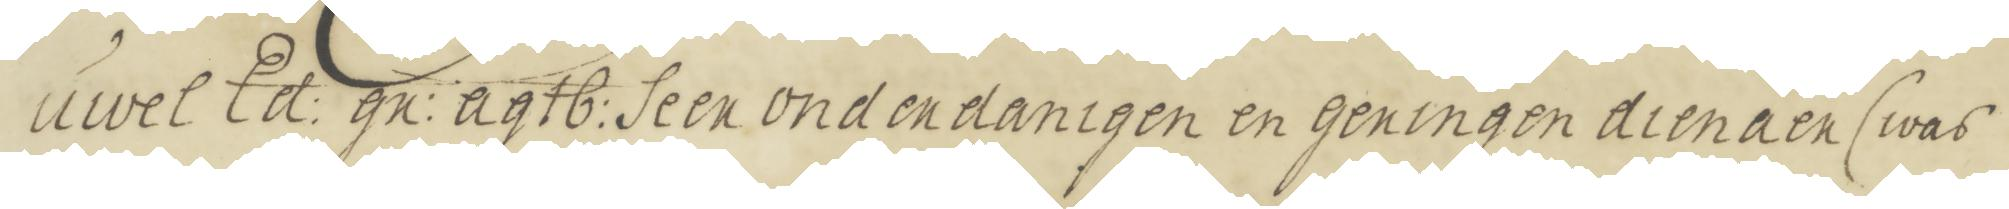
uwel Ed: gr: agtb: seer onderdanigen en geringen dienaer (was
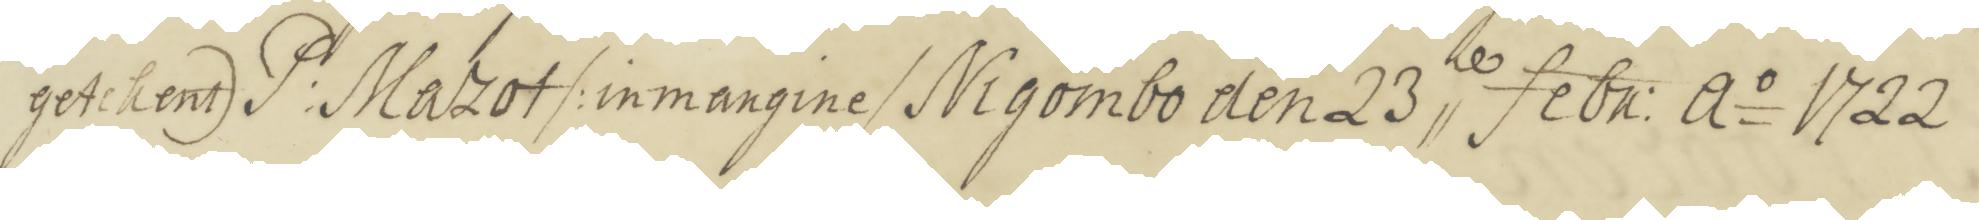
getekend) P: Mazot /:in margine / Nigombo den 23„e febr: A=o 1722
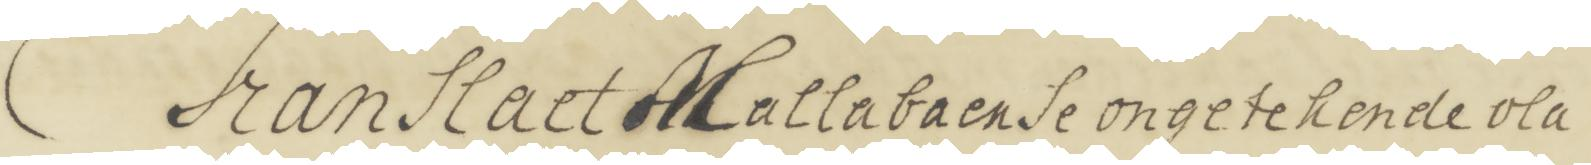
Translaet Mallabaerse ongetekende ola
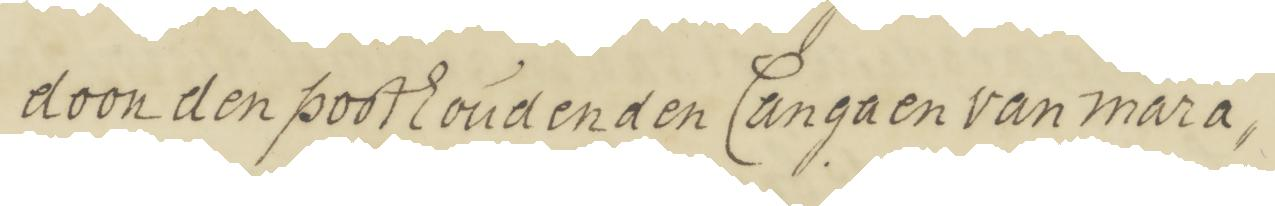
door den posthouder den Cangaen van mara„
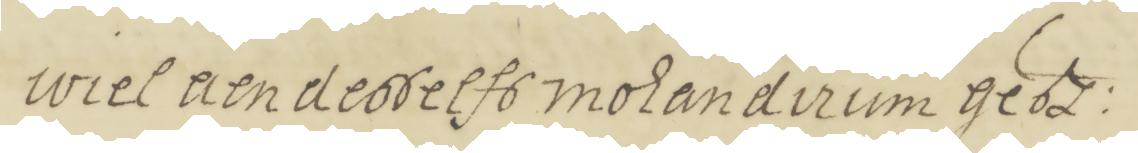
wiel aen desselfs mohandirum gesz:
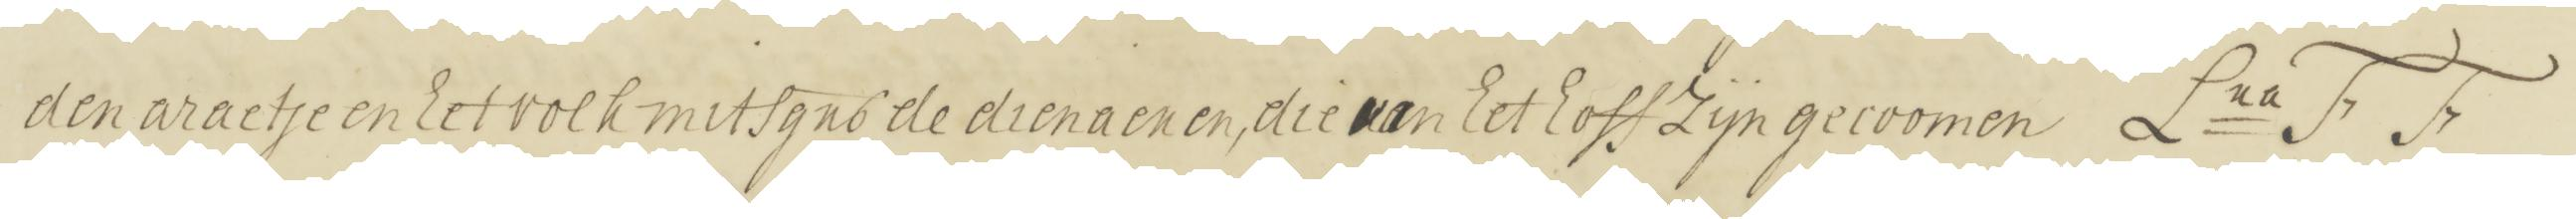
den araetje en het volk mitsgrs de dienaeren, die van het hoff zijn gecoomen L=ra F F
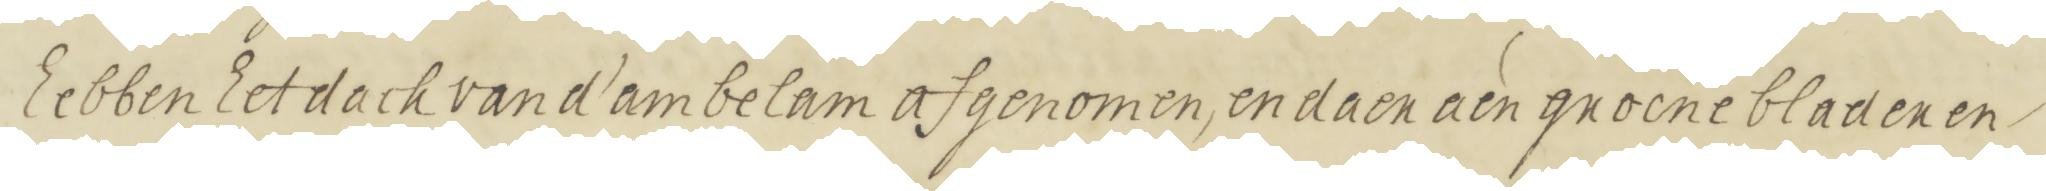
hebben het dack van d’ambelam afgenomen, en daer aen groene bladeren
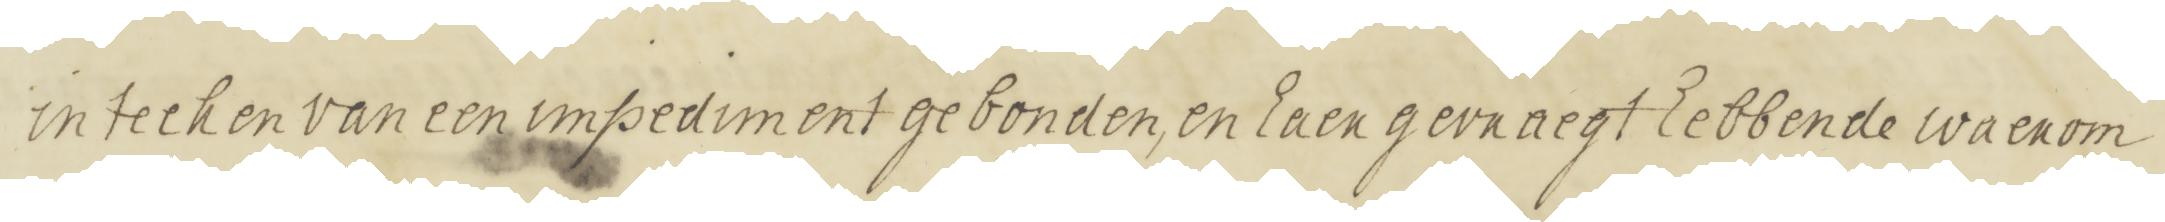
in teeken van een impediment gebonden, en haer gevraegt hebbende waerom
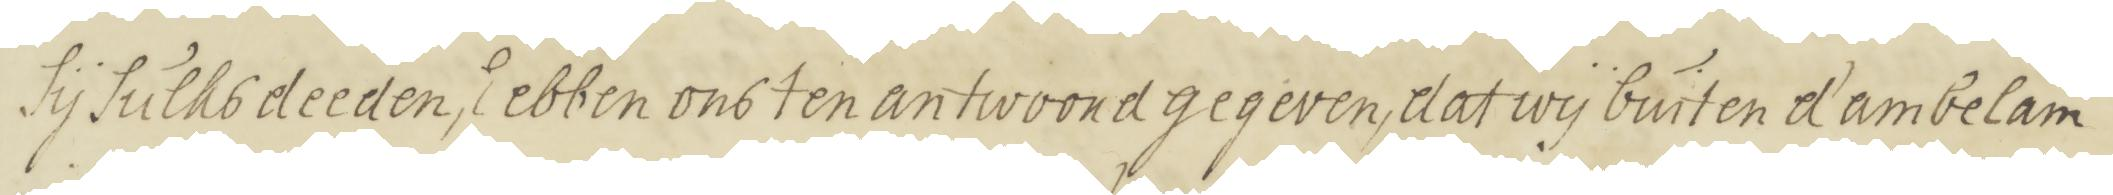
sij sulks deeden, hebben ons ten antwoord gegeven, dat wij buiten d'ambelam
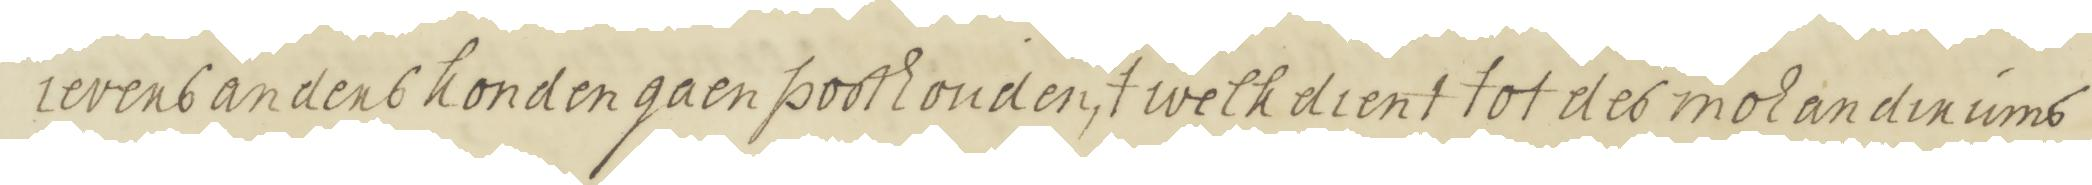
ievers anders konden gaen posthouden, 't welk dient tot des mohandirums
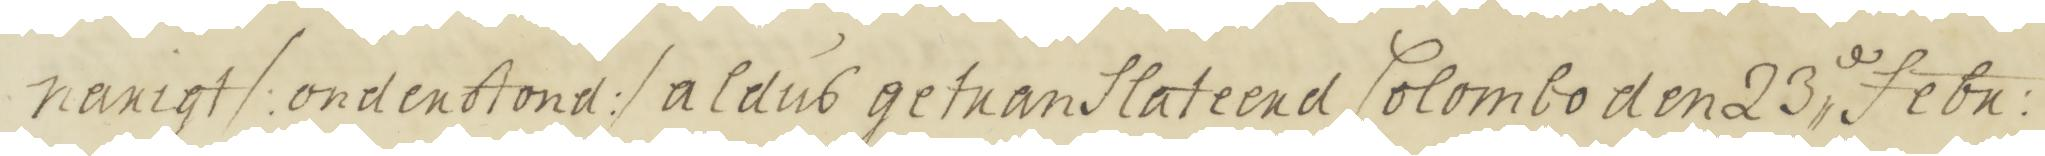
narigt /:onderstond:/ aldus getranslateerd Colombo den 23„e febr:
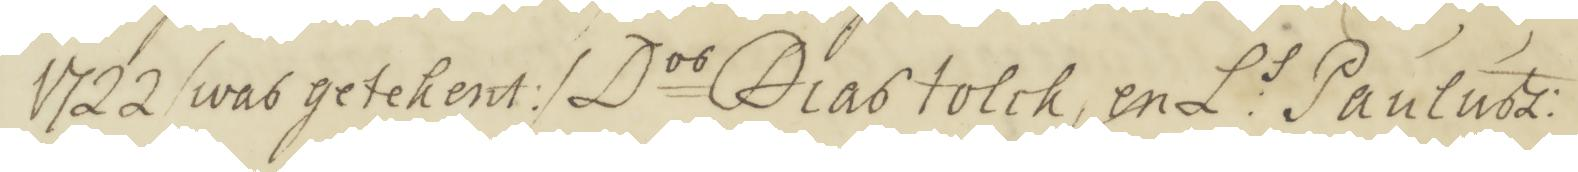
1722 /:was getekent:/ D=os Diastolck, en L:s Paulusz:
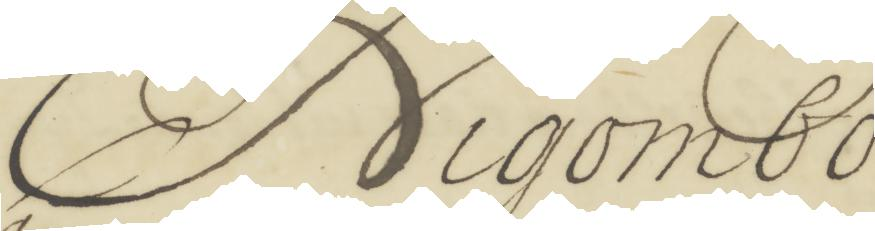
Nigombo
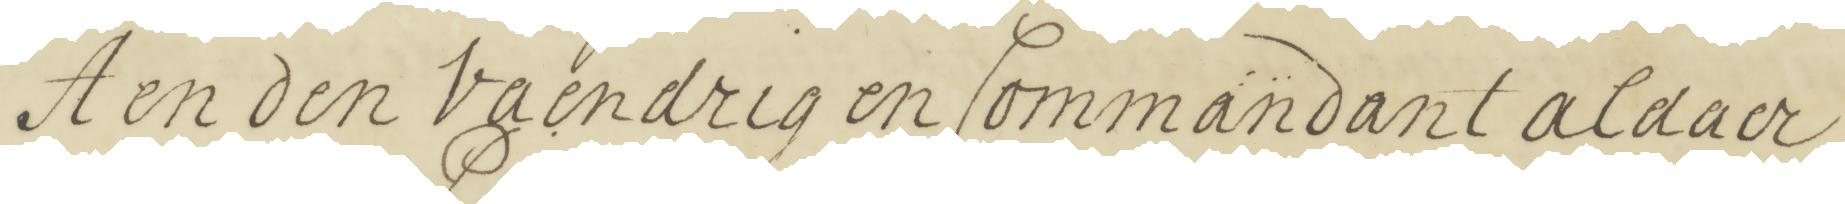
Aen den vaendrig en Commandant aldaer
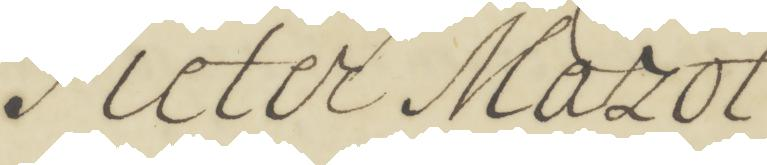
Pieter Mazot
